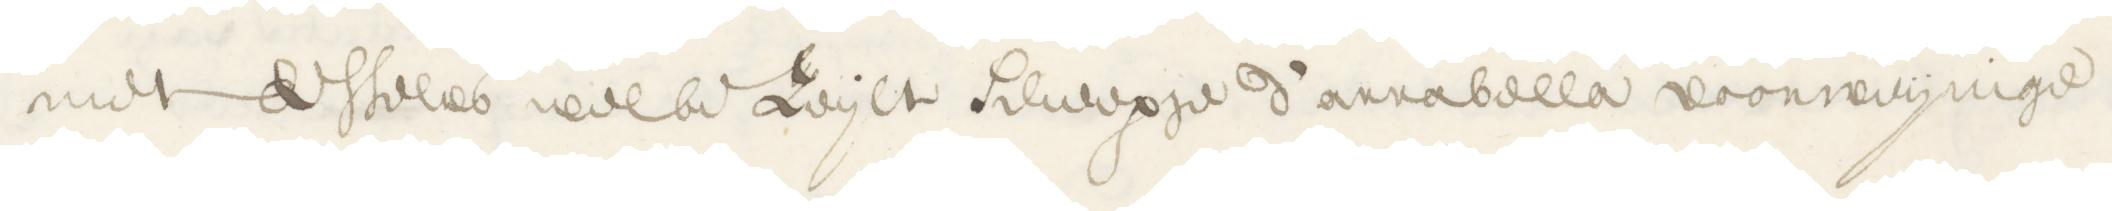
met desselvs welk zeijlt scheepje d’arrabella voor weijnige
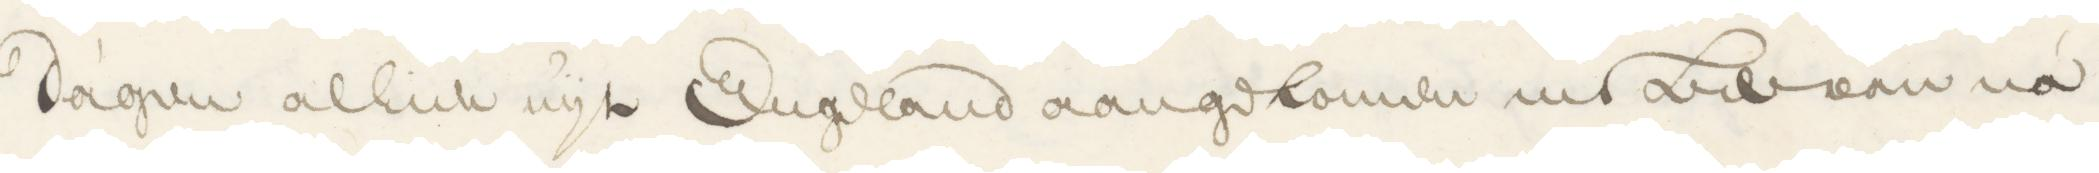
dagen alhier uijt Engeland aangekomen instede van na
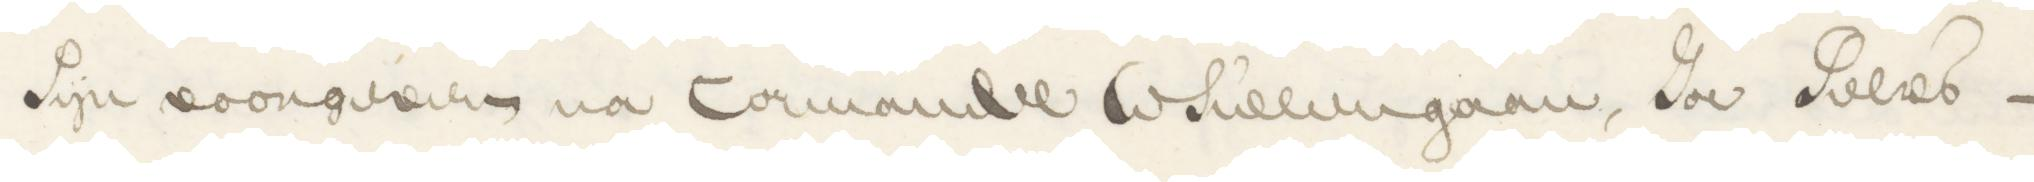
sijn voorgeven na Cormandel te sullen gaan, Ia selvs -
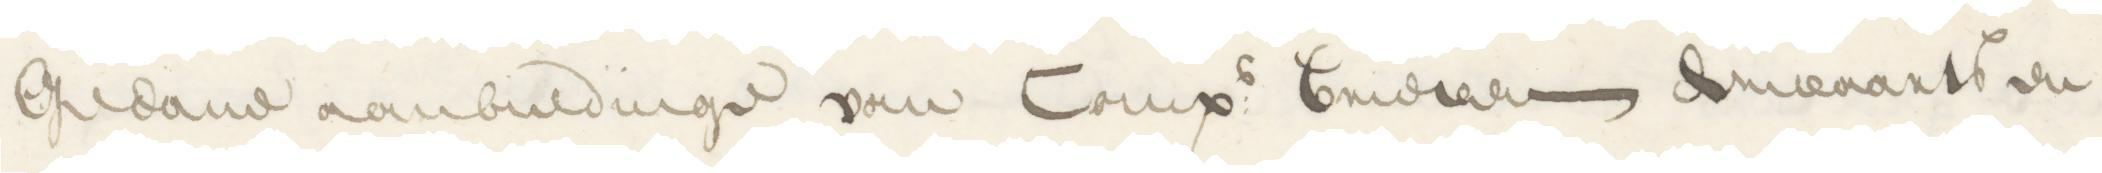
gedane aanbiedinge van Comp:s brieven derwaarts en
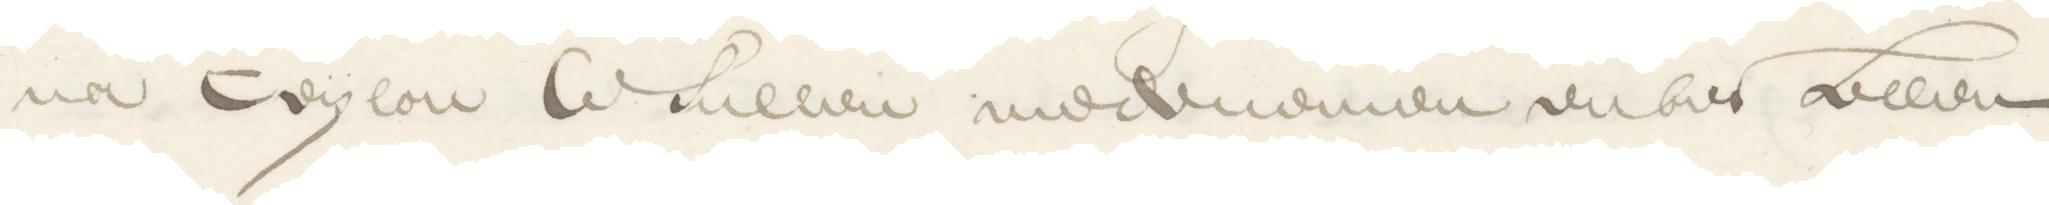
na Ceijlon te sullen medenemen en bestellen
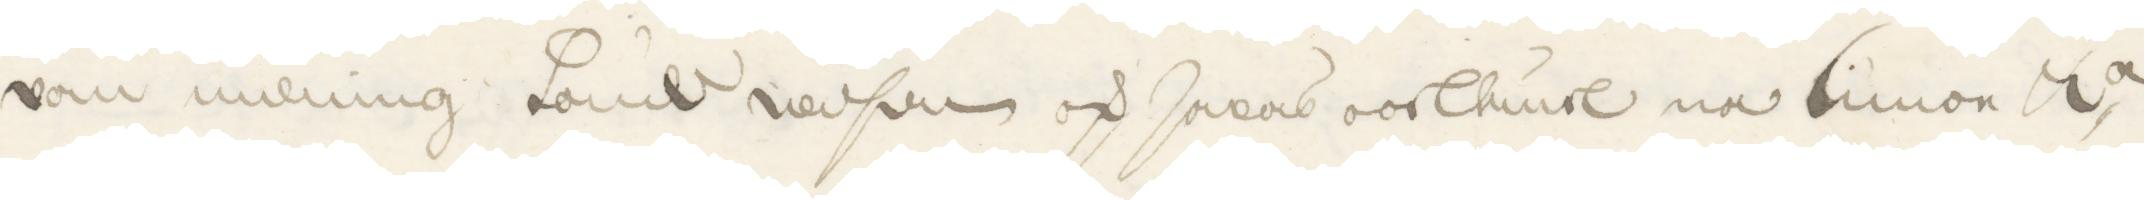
van mening soude wesen over Javas oostkust na Timor &„a
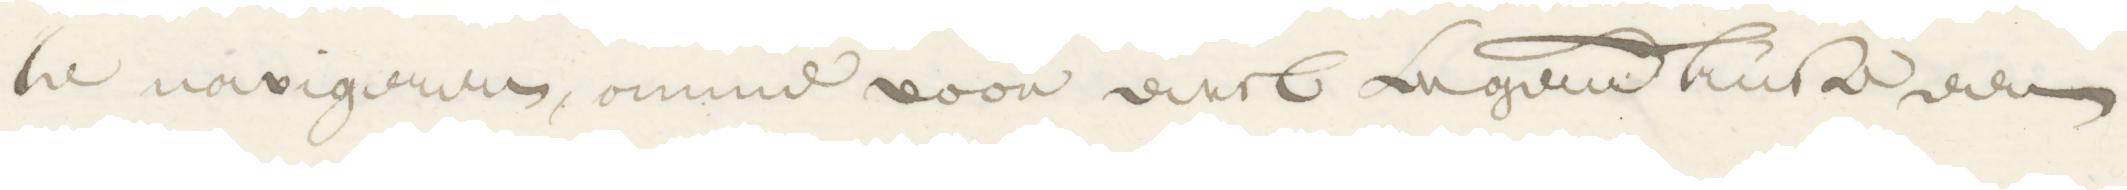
te navigeren, omme voor eerst ter gem: kuste een
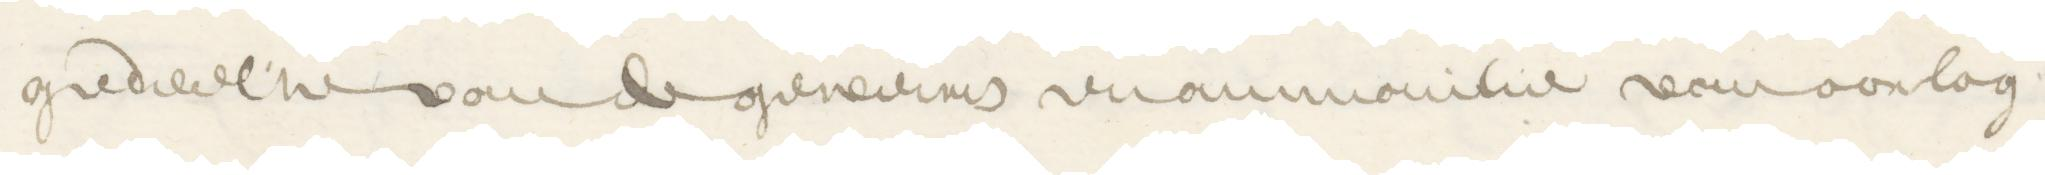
gedeelte van de geweiren en ammonitie van oorlog
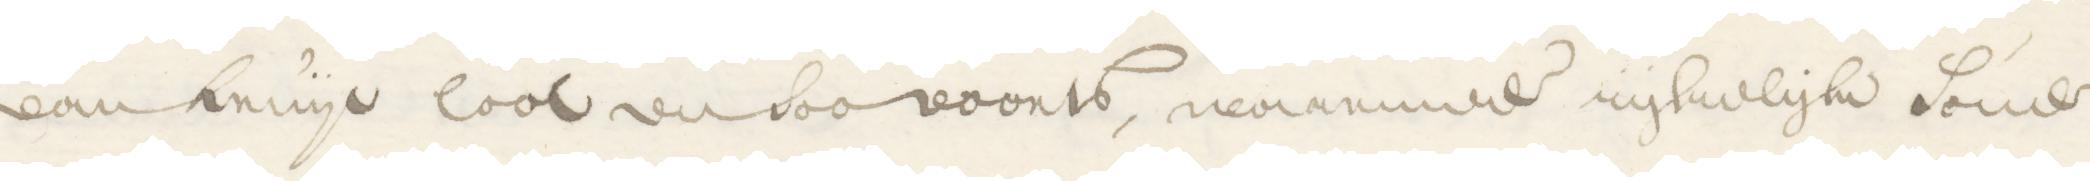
van kruijt loot en soo voorts, waarmede rijkelijk soude
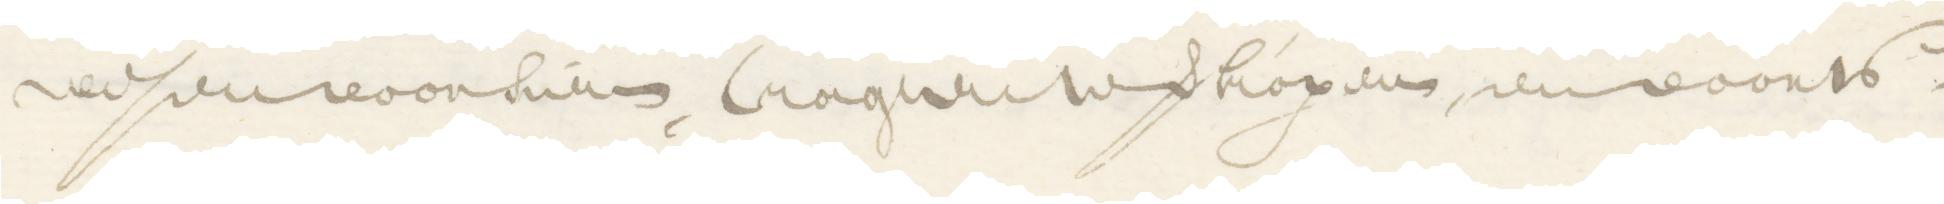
wesen voor sien, tragten te verkopen, en voorts.
